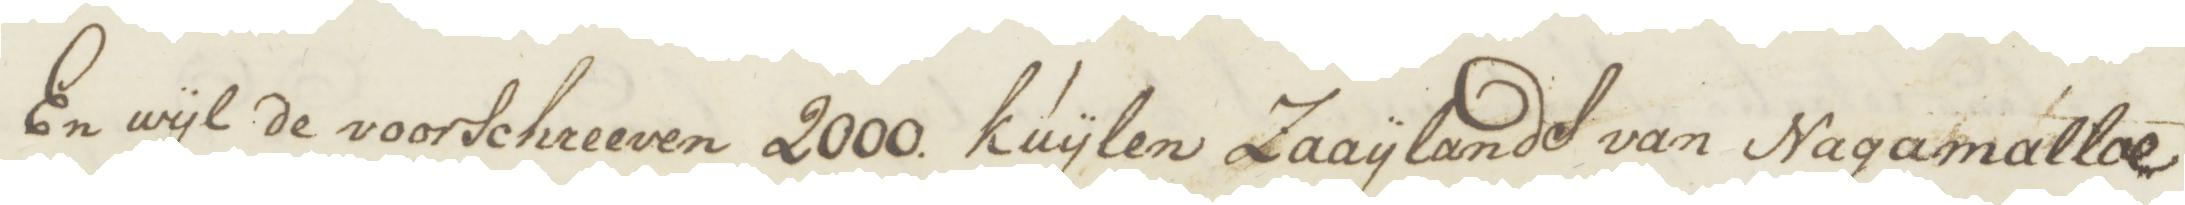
En wijl de voorschreeven 2000. kuijlen Zaaijlands van Nagamalloe
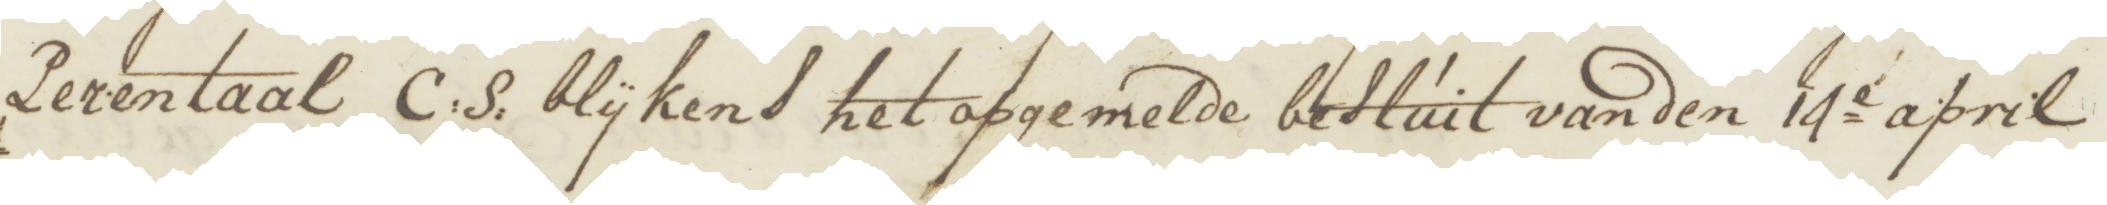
Terentaal C:S: blijkens het opgemelde besluit van den 14=e april
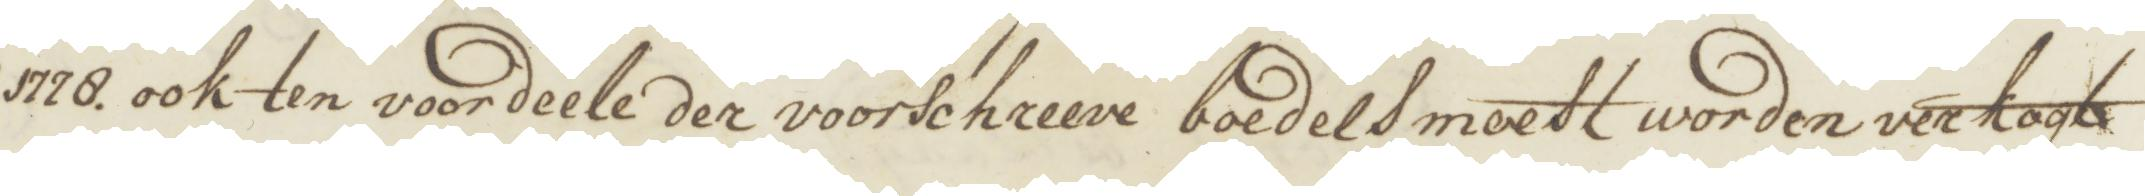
1778. ook ten voor deele der voorschreeve boedels moest worden verkogt
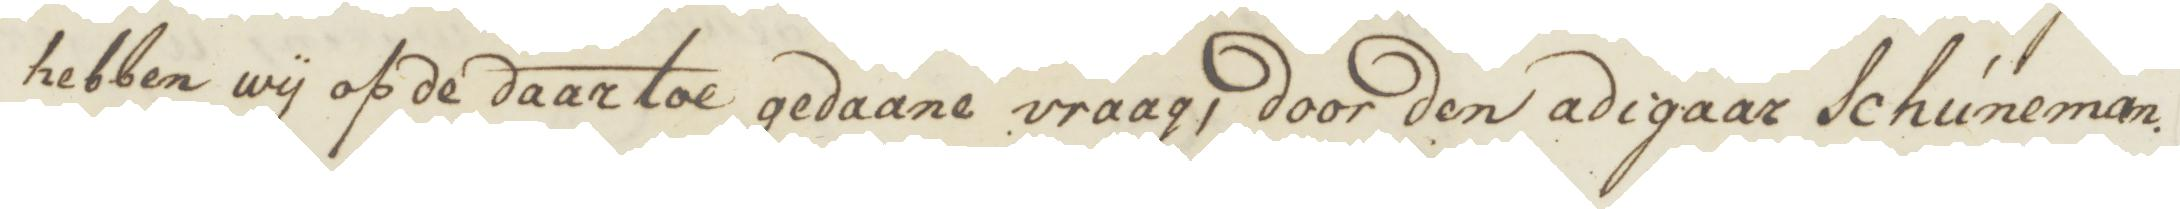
hebben wij op de daar toe gedaane vraag, door den adigaar Schuneman
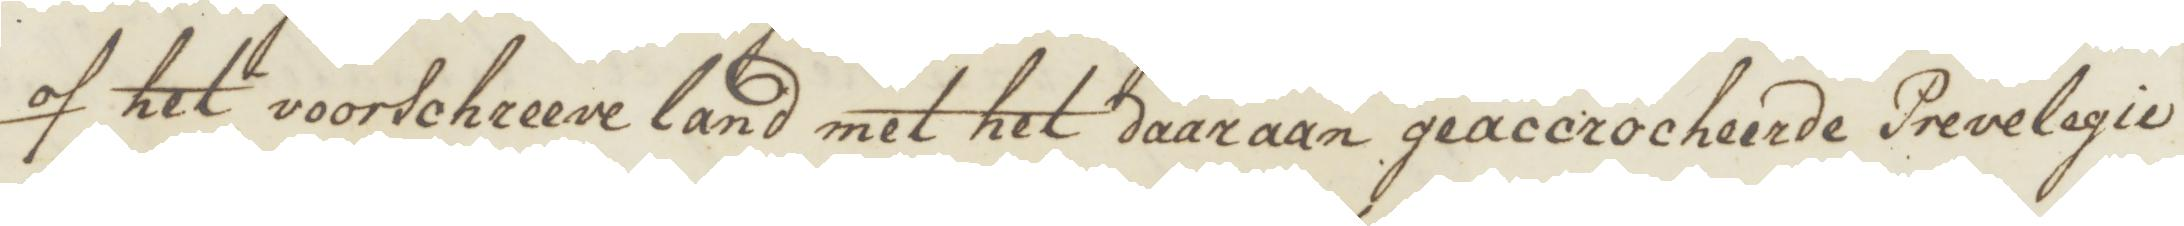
of het voorschreeve land met het daar aan geaccrocheerde Prevelegie
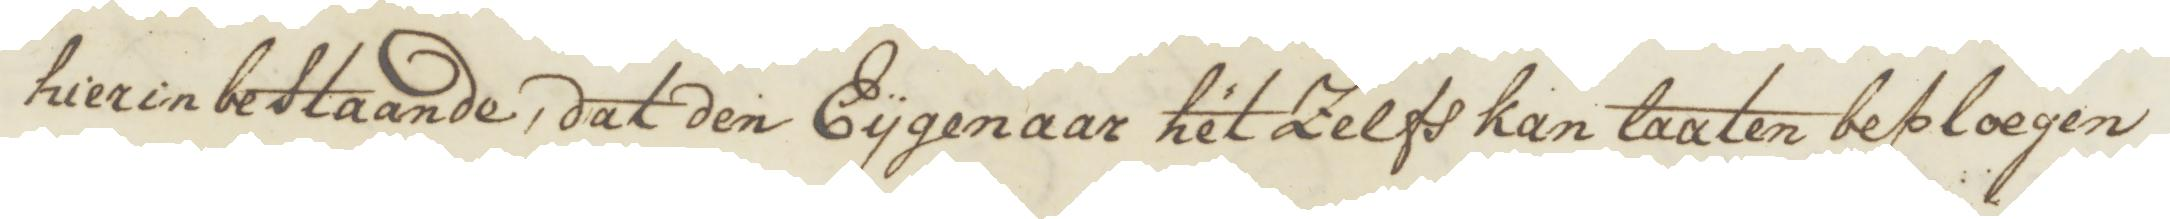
hier in bestaande, dat den Eijgenaar het Zelfs kan laaten beploegen
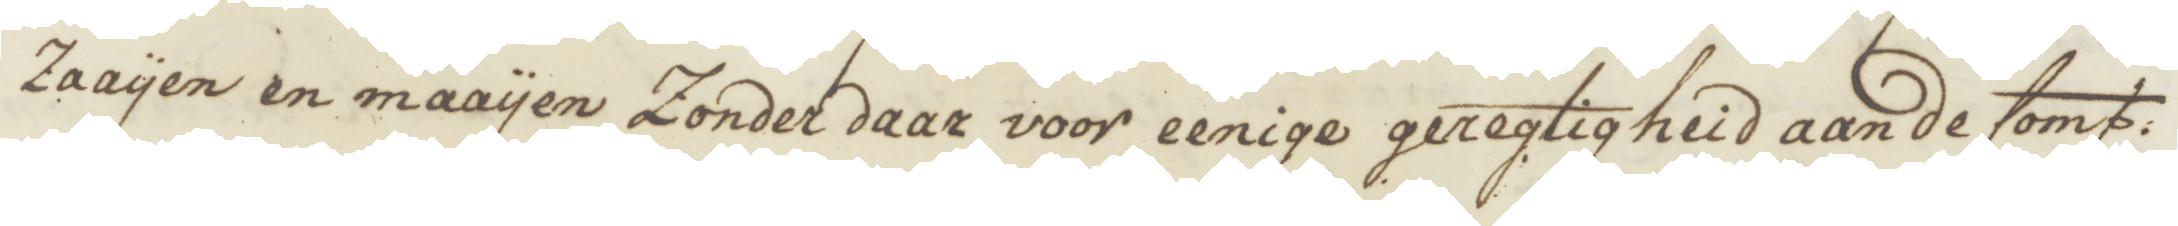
Zaaijen en maaijen Zonder daar voor eenige geregtigheid aan de Comp:
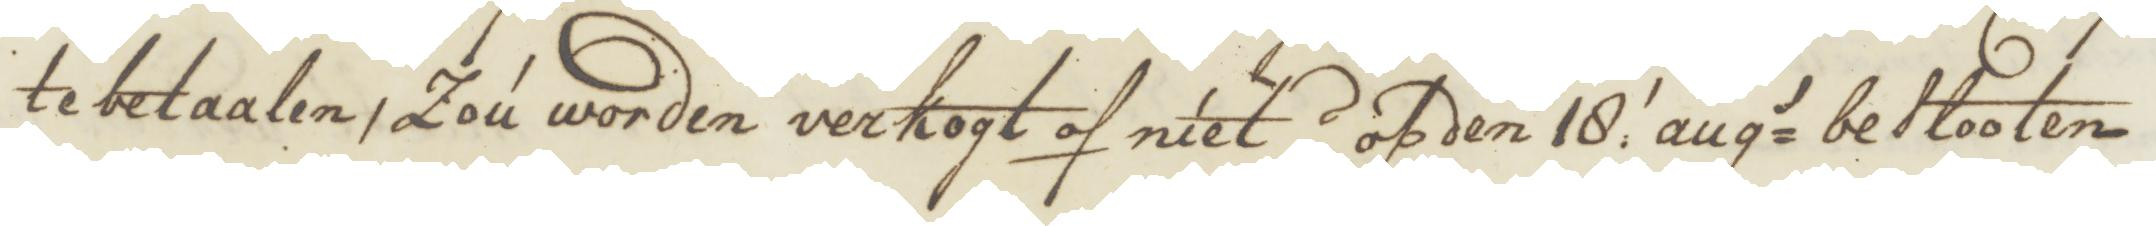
te betaalen, Zou worden verkogt of niet ? op den 18:' aug=s beslooten
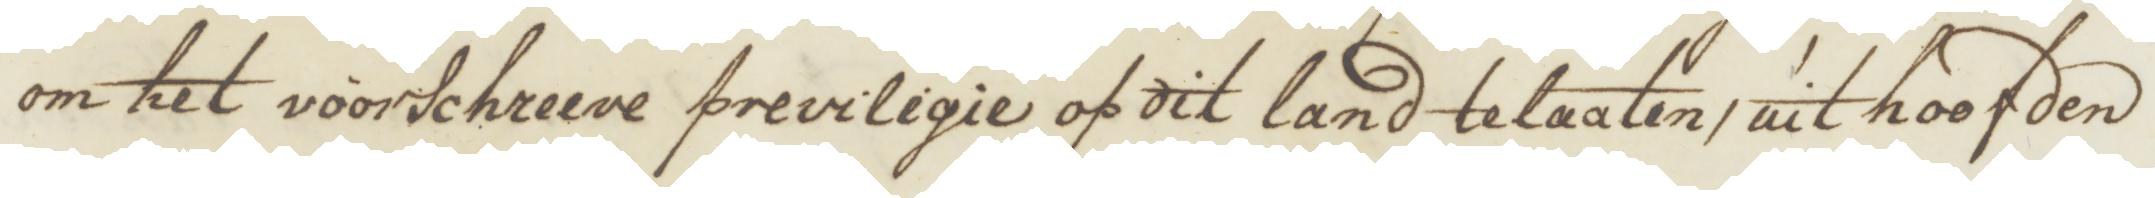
om het voorschreeve previlegie op dit land te laaten, uit hoofden
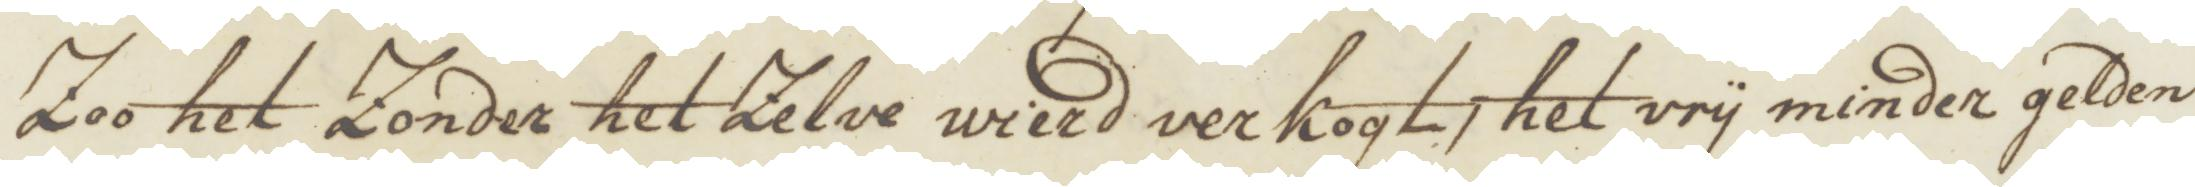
Zoo het Zonder het Zelve wierd verkogt, het vrij minder gelden
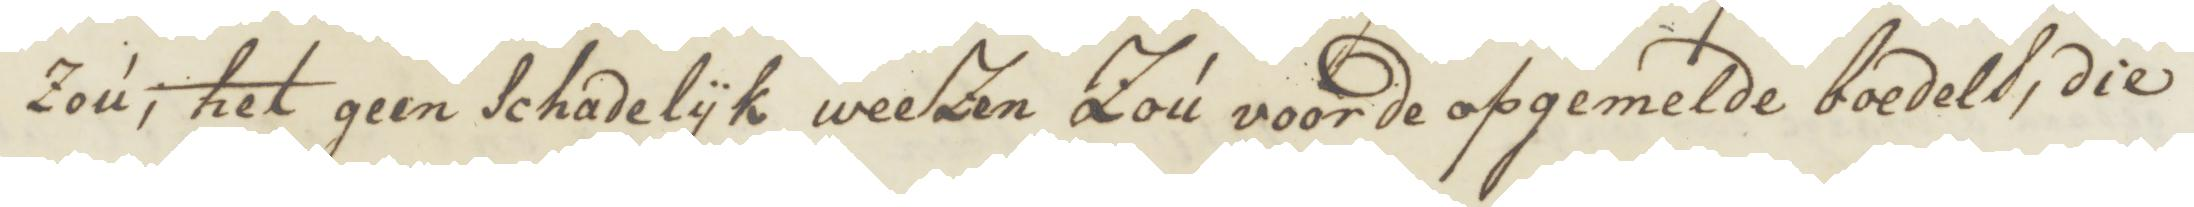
Zou, het geen Schadelijk weezen Zou voor de opgemelde boedels, die
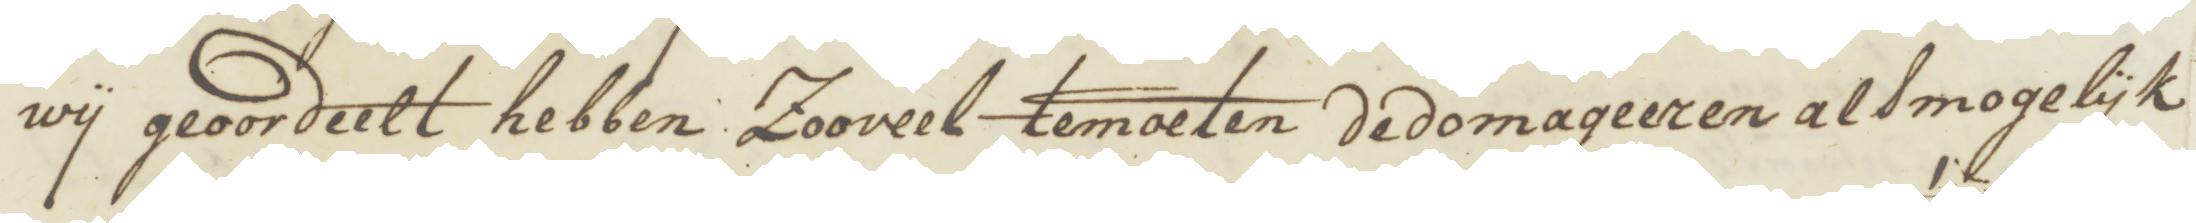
wij geoordeelt hebben Zooveel temoeten dedomageeren als mogelijk
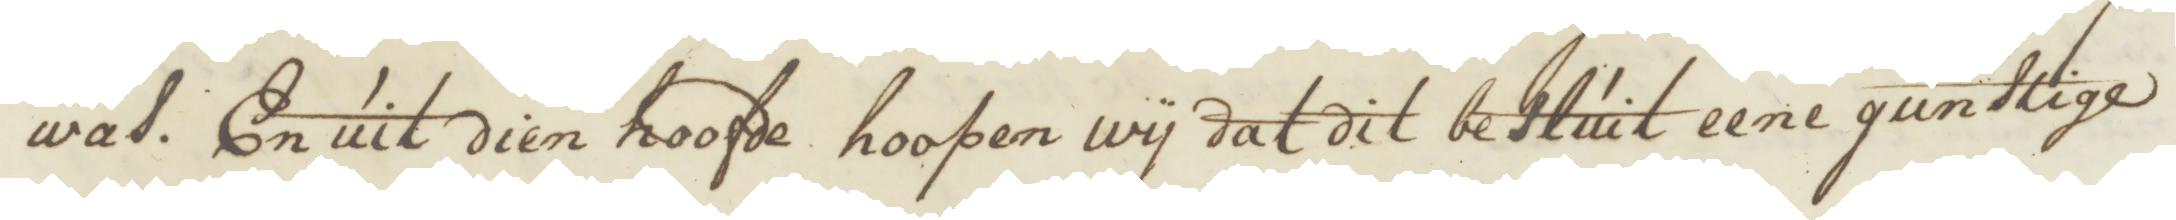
was. En uit dien hoofde hoopen wij dat dit besluit eene gunstige
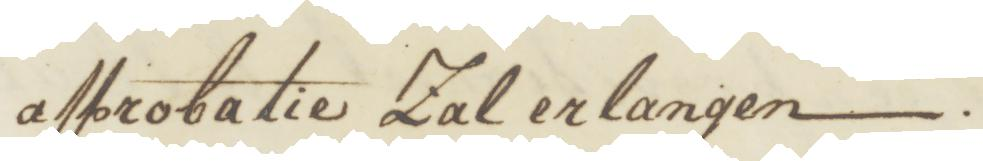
approbatie Zal erlangen.
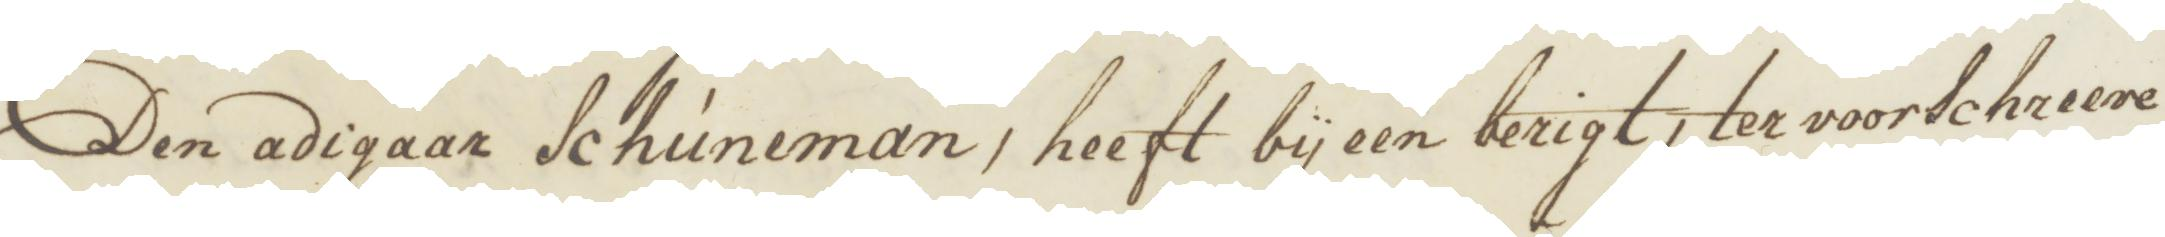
Den adigaar Schuneman, heeft bij een berigt, ter voorschreeve
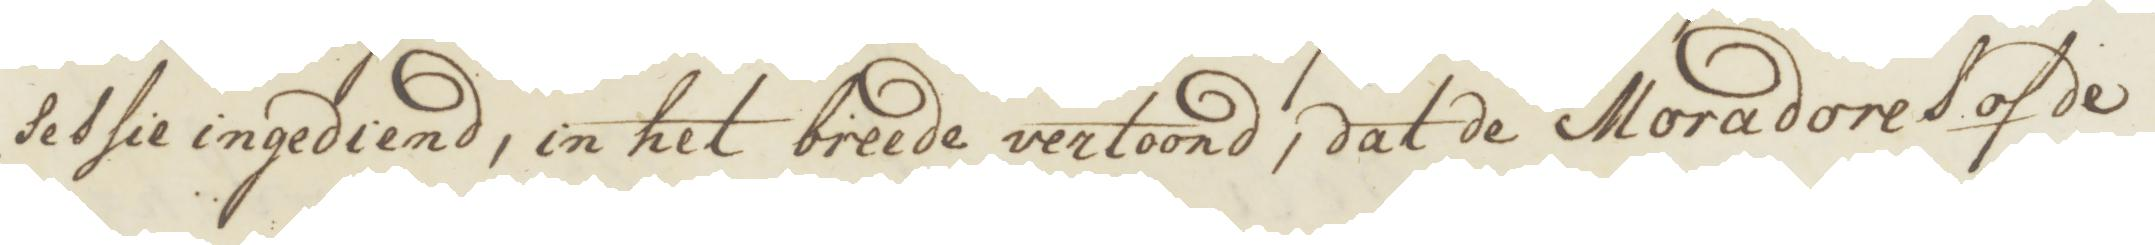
sessie ingediend, in het breede vertoond, dat de Moradores of de
